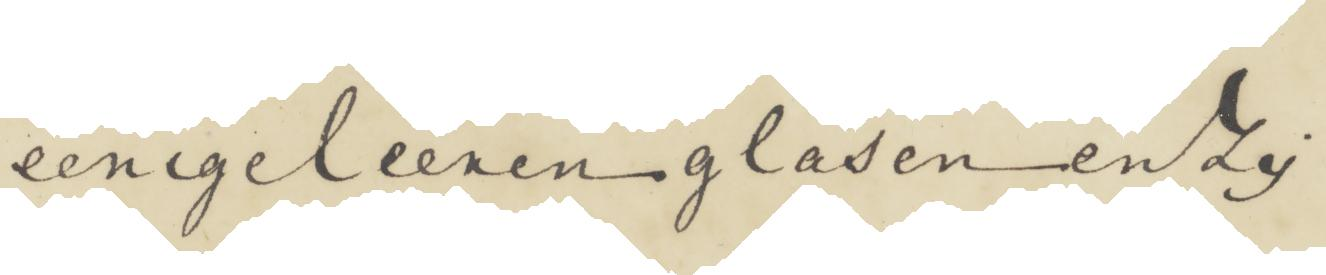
eenigeleeren glasen en zij
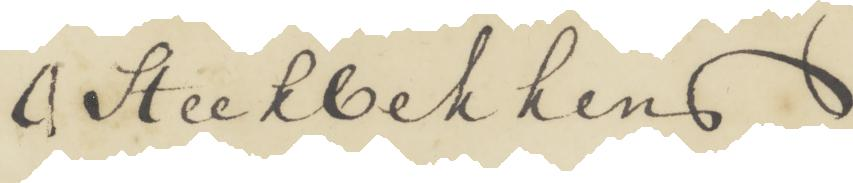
4 steekbekkens
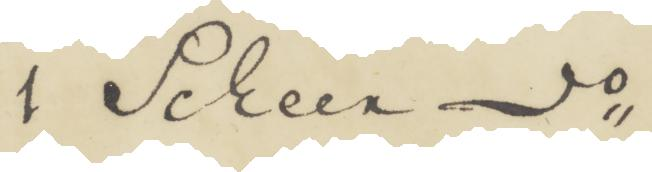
1 scheer _„o
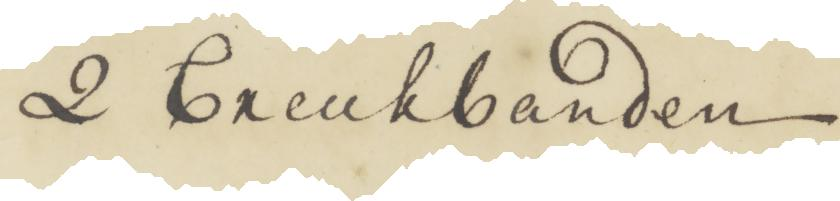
2 brenkbanden
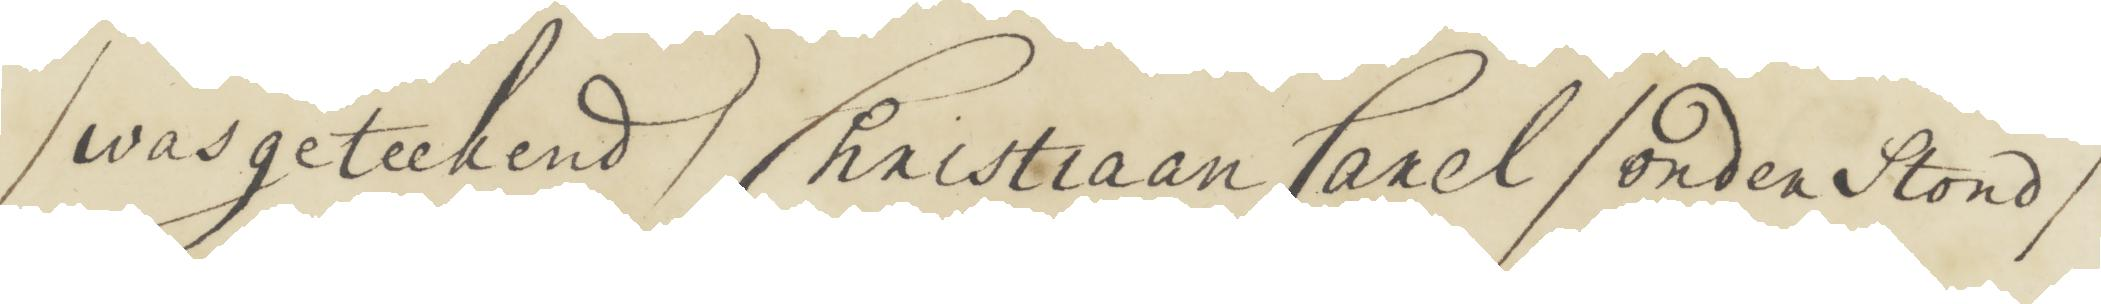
/was geteekend/ Christiaan Carel /onderstond/
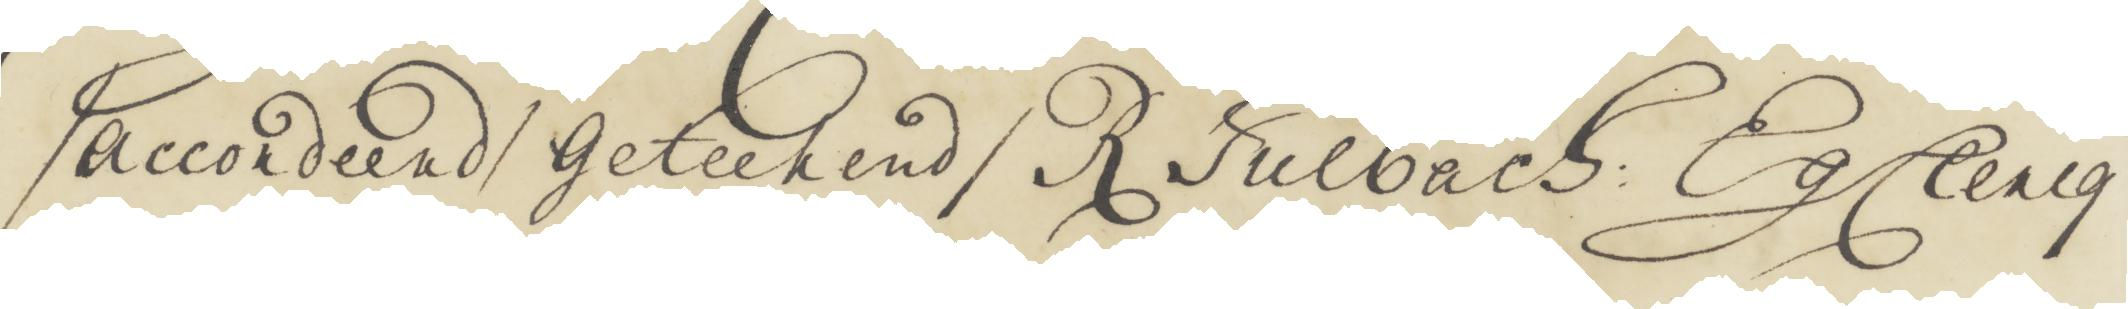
/accordeerd/ geteekend / R Tulbach: EgClercq
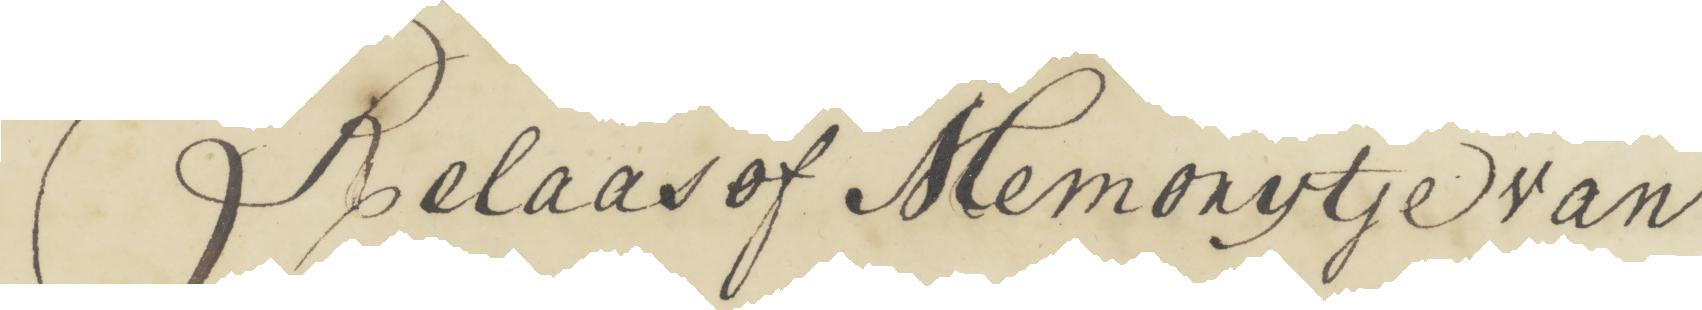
Relaas of Memorijtje van
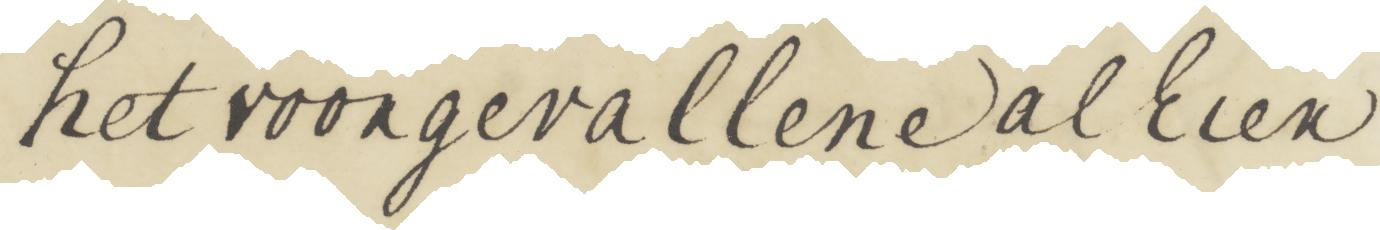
het voorgevallene alhier
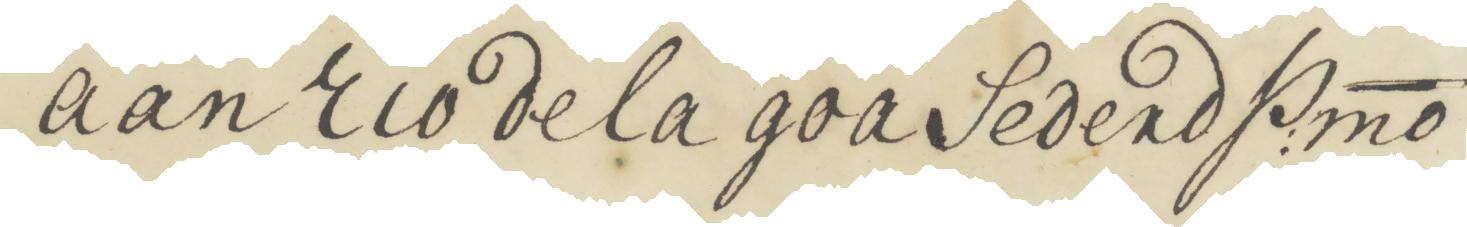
aan rio dela goa sederd p:mo
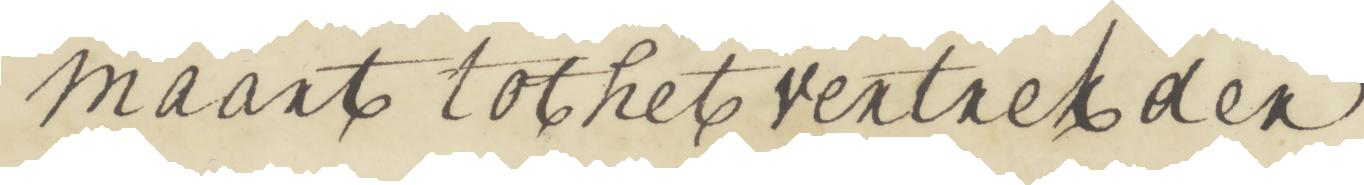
maart tot het vertrek der
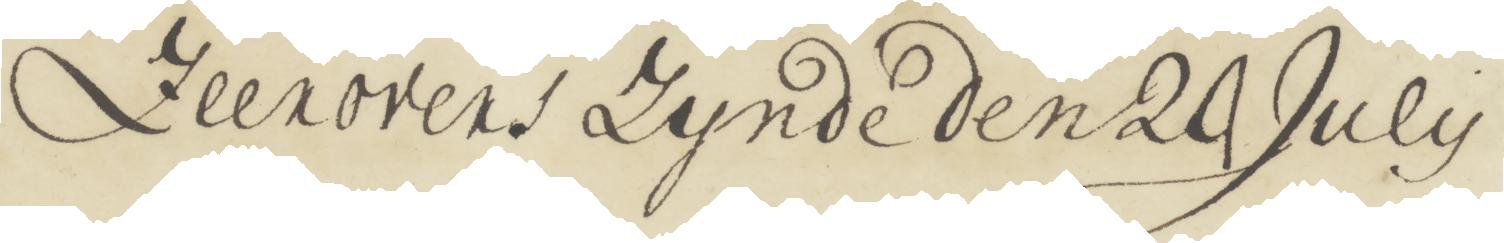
zeerovers zynde den 24 Julij
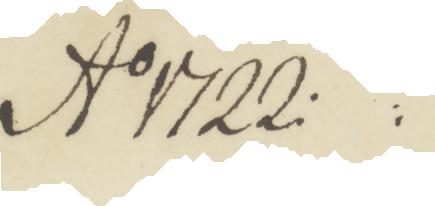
Ao 1722: :
